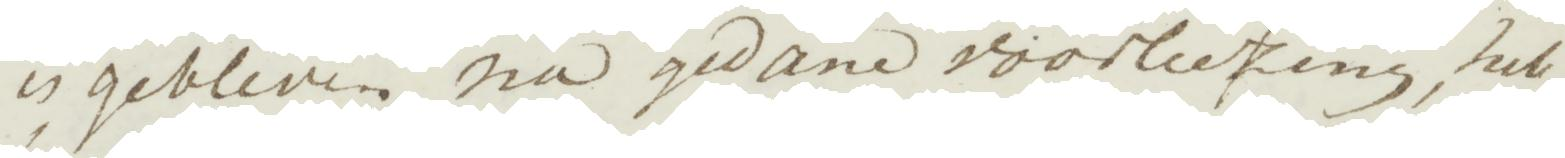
is gebleven, na gedane voorleezing, heb=
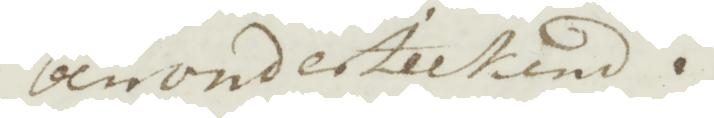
=ben onderteekend.
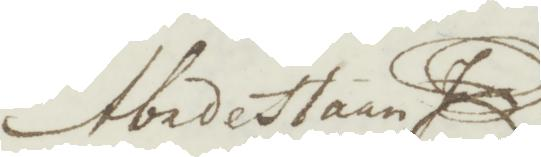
Abr de Haan J
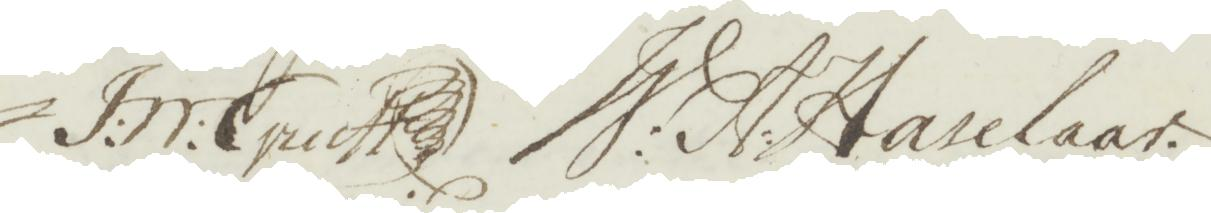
J:W:Greeff. W:A: Haselaar.
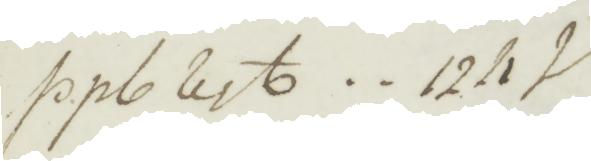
p.pC regt . . 124 2
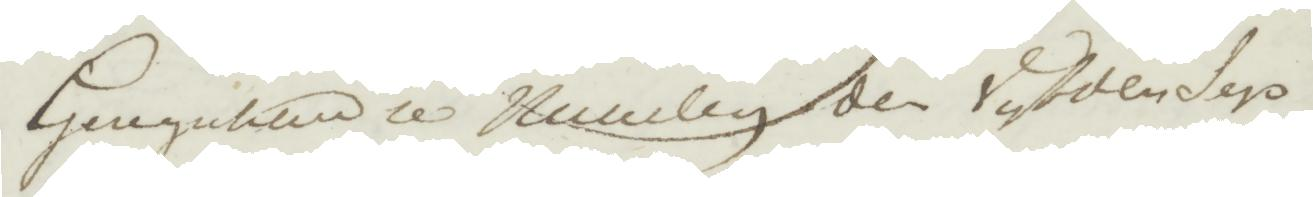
Geregistreerd te Haarlem den Vyfden Sep
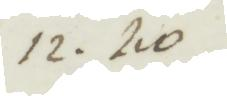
12. 20
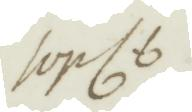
10 pCt
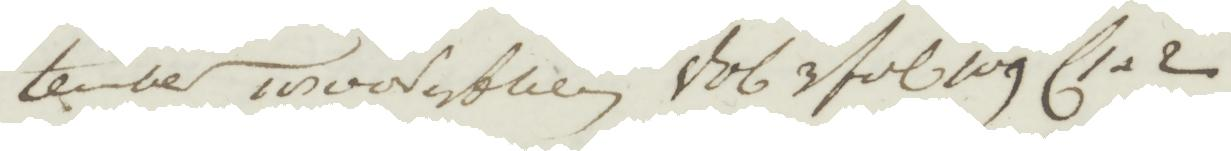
tember 1800 Vyftien Vol 3 folio 9 C 1 & 2
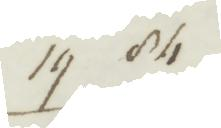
19 84
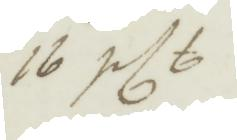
16 pCt
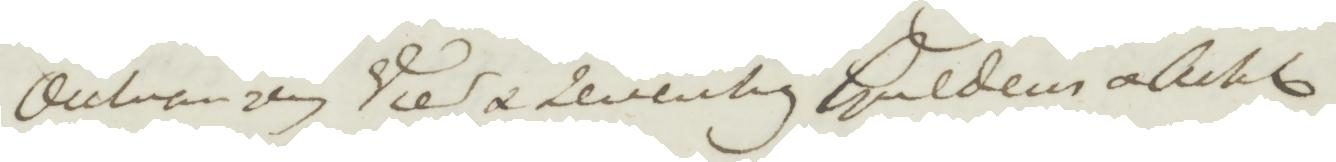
Ontvangen Vier & zeventig Guldens & acht
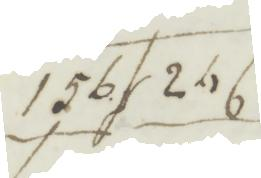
156 fr 24C
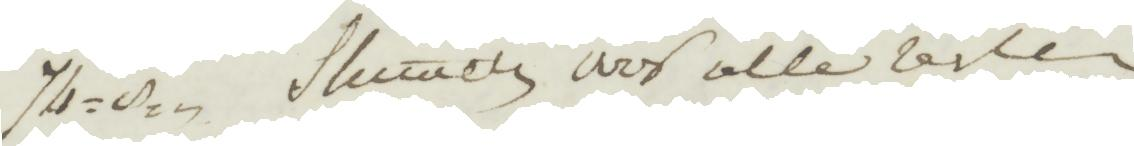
ƒ 74= 8= – Stuivers voor alle regten
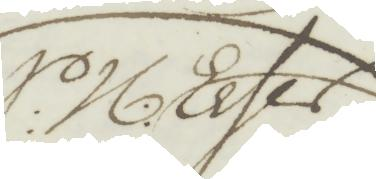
V: H: Eeser.
